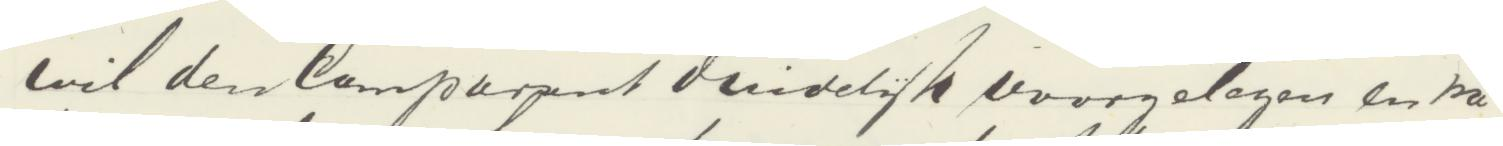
wil den Comparant duidelijk voorgelezen en na
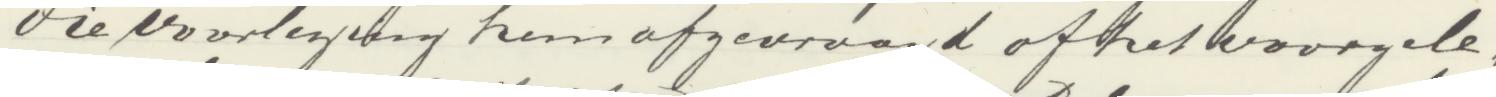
die voorlezing hem afgevraagd of het voorgele
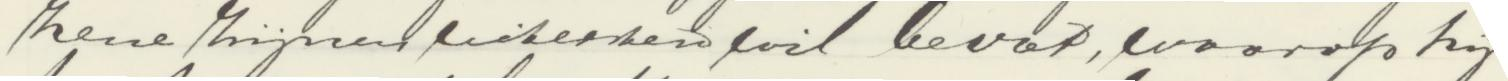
zene zijnen uitersten wil bevat, waarop hij
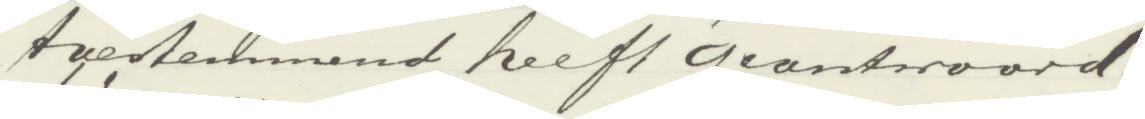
toestemmend heeft geantwoord.
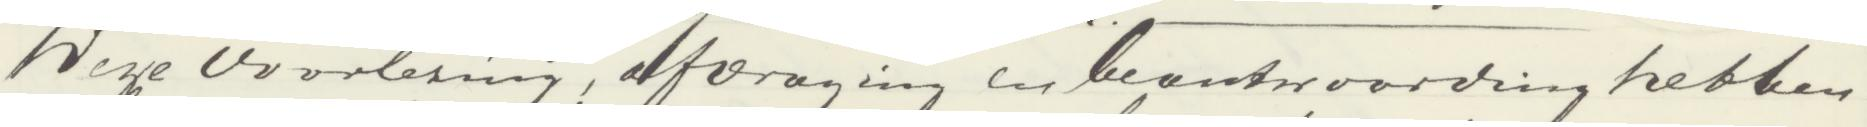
Deze voorlezing, afvraging en beantwoording hebben
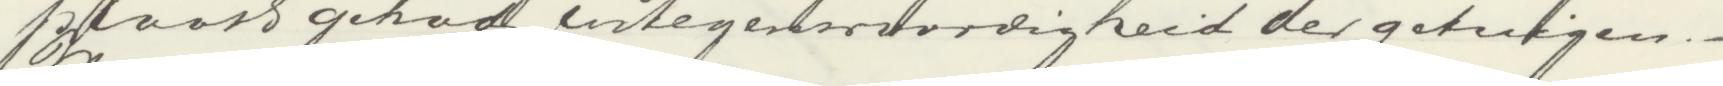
plaats gehad integenwoordigheid der getuigen.
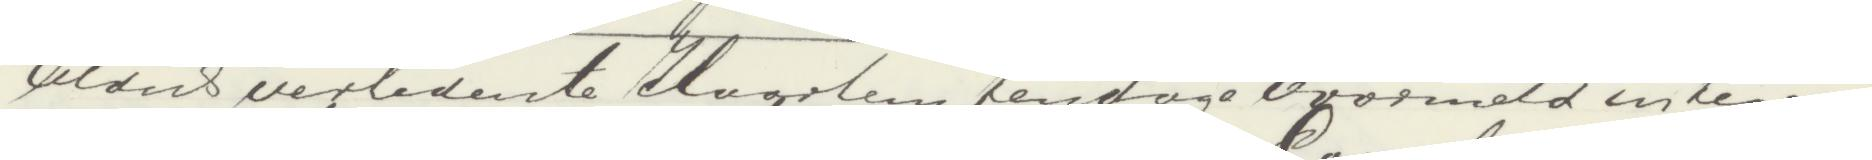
Aldus verleden te Haarlem ten dage voormeld in tegen
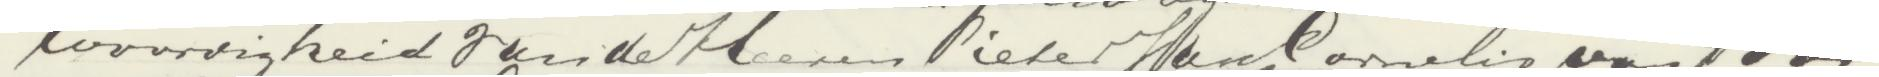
woordigheid van de Heeren Pieter Jan Cornelis van Toor
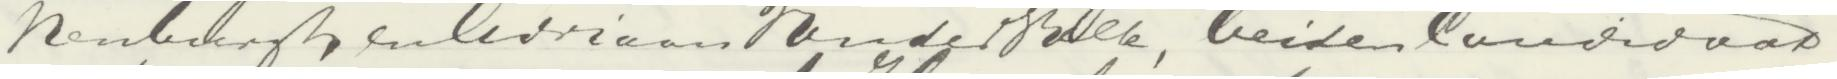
nenburgh en Adriaan Vander Valk, beiden Candidaat
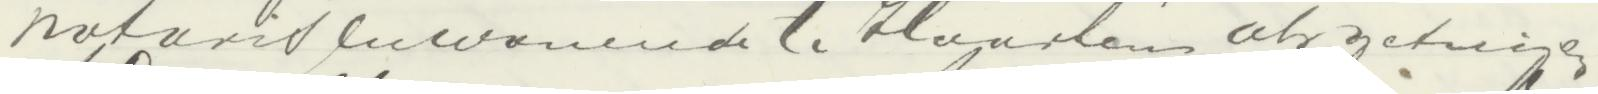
notaris en wonende te Haarlem als getuigen
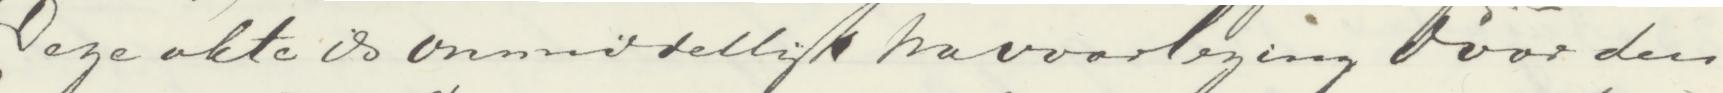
Deze akte is onmiddellijk na voorlezing door den
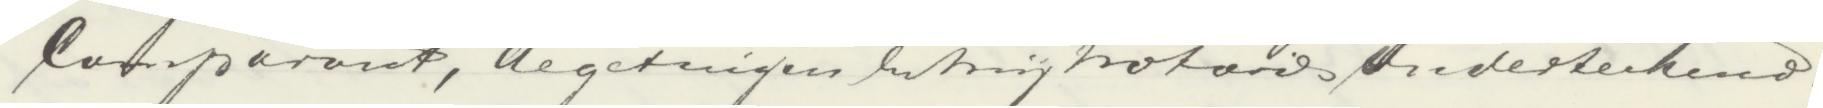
Comparant, de getuigen en mij notaris onderteekend
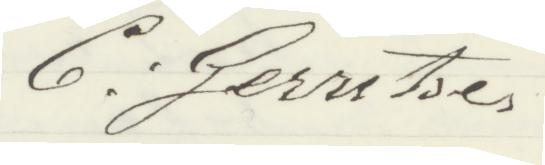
C: Gerritse
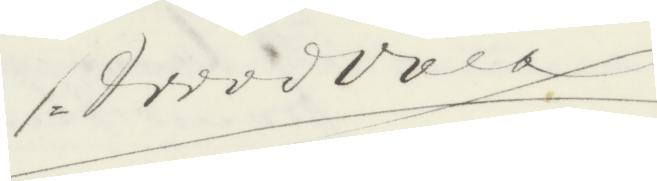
Adr vdValk
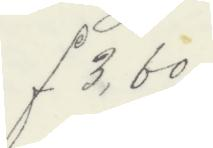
ƒ3,60
